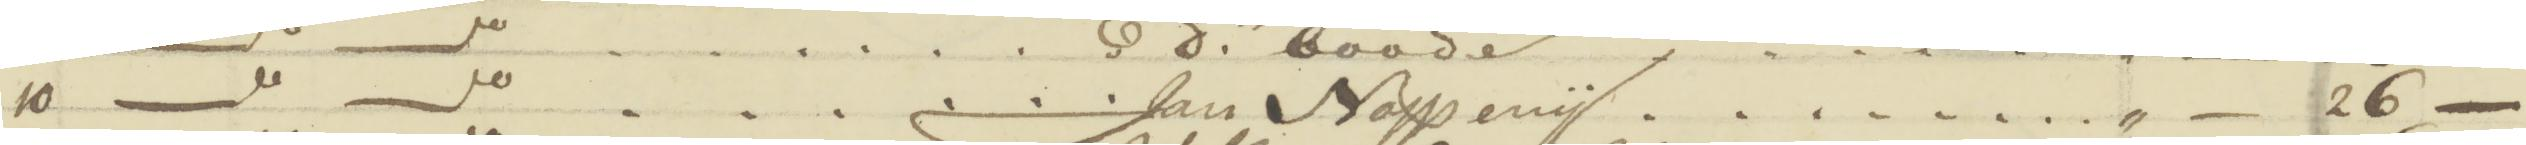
10 _o _o - - . . . . Jan Noppenij . . . - - - . . „ — 26 —
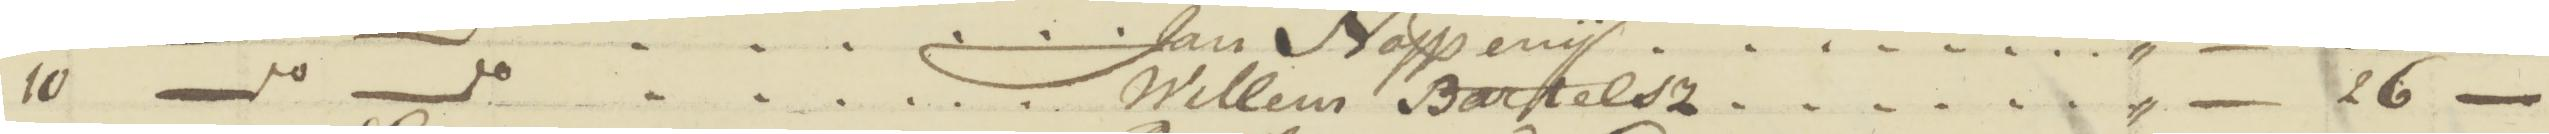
10 _o _o - - . . . . Willem Bartelsz - - - - - . „ — 26 —
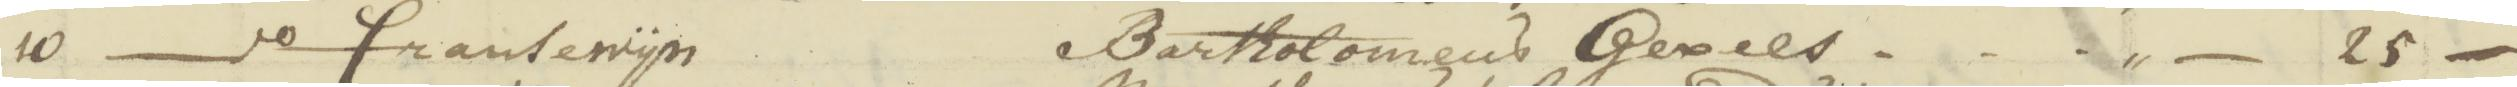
10 _o fransewijn Bartholomeus Gevels - - - „ — 25 —
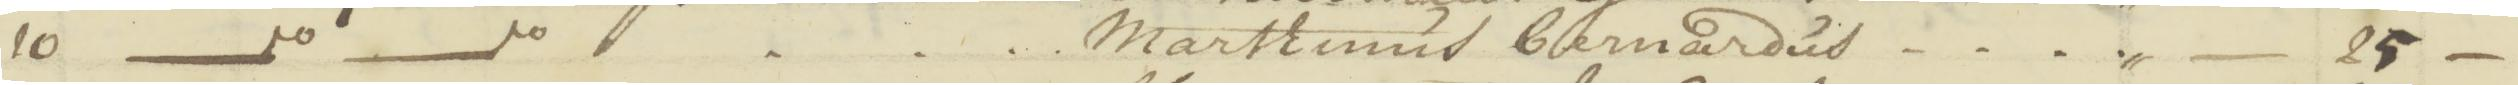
10 _o _o . . . . Marthinus bernardus - - - .„ — 25 —
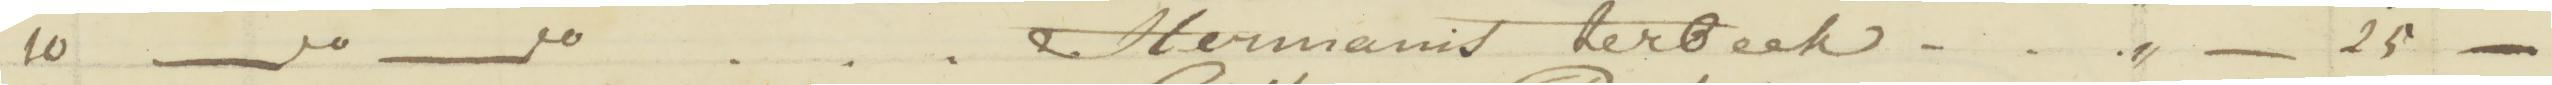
10 _o _o . . . Hermanis terbeek - . .„ — 25 —
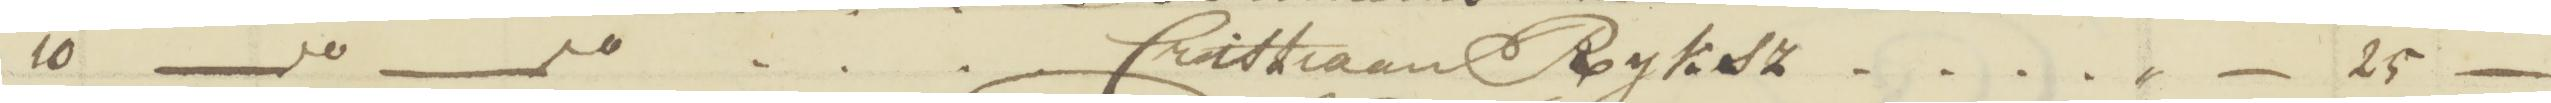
10 _o _o - . . . Chistiaan Ryksz . . . . „ — 25 —
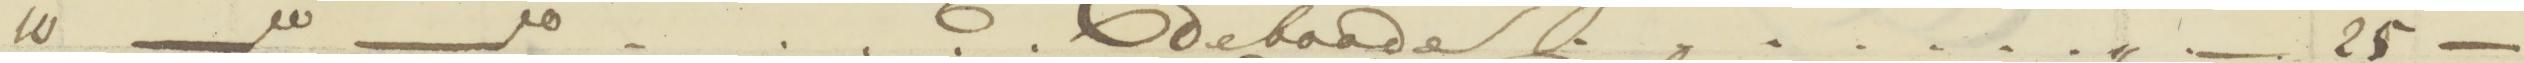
10 _o _o - . . . . deboode . . . . . . . „ — 25 —
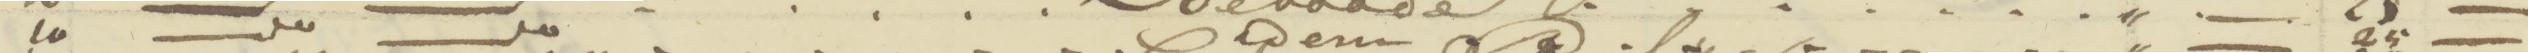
10 _o _o - . . . - - . idem . - - - - - - - .„ — 25 —
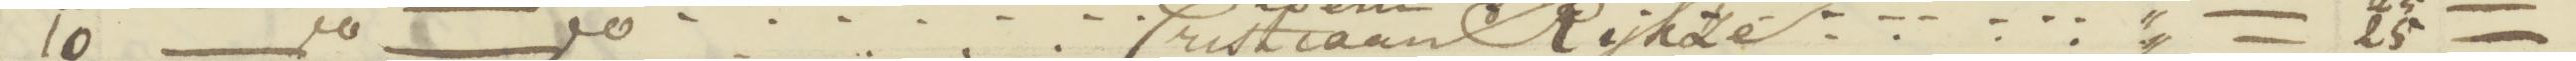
10 _o _o - .. . . Cristiaan Rijkze . . . . „ — 25 —
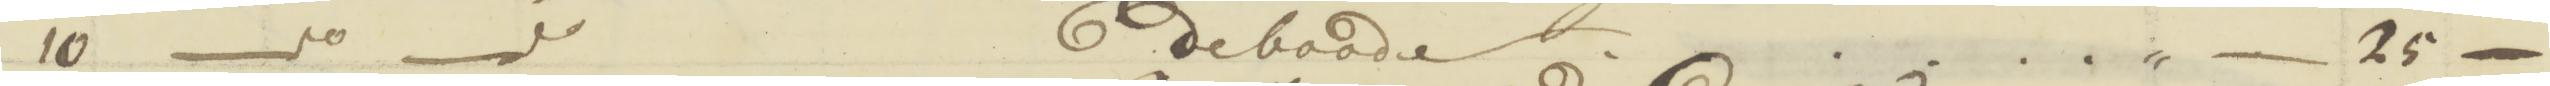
10 _o _o de boode . . . . . „ — 25 —
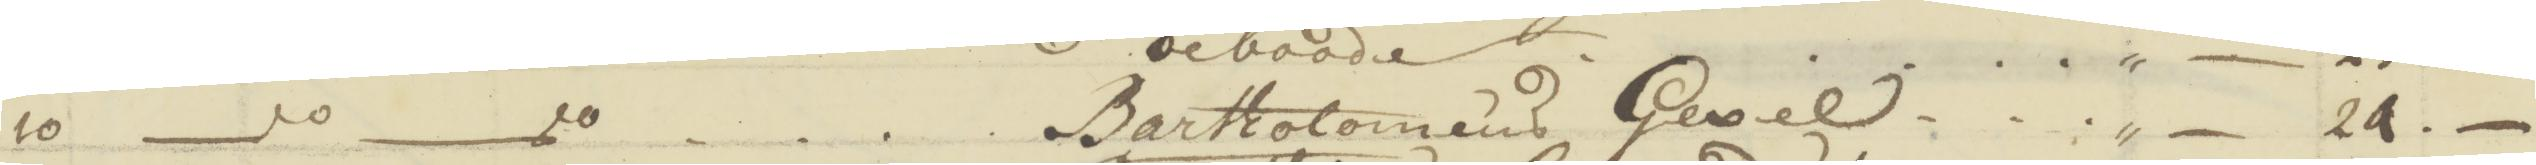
10 _o _o - . . . Bartholomeus Gevel - - . „ — 24. —
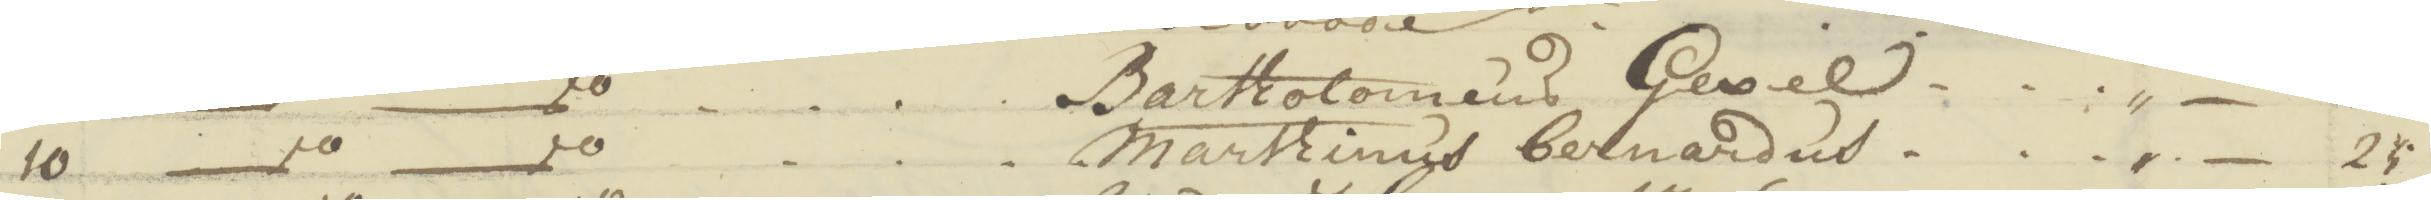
10 _o _o - . . marthinus bernardus - . . „ — 25
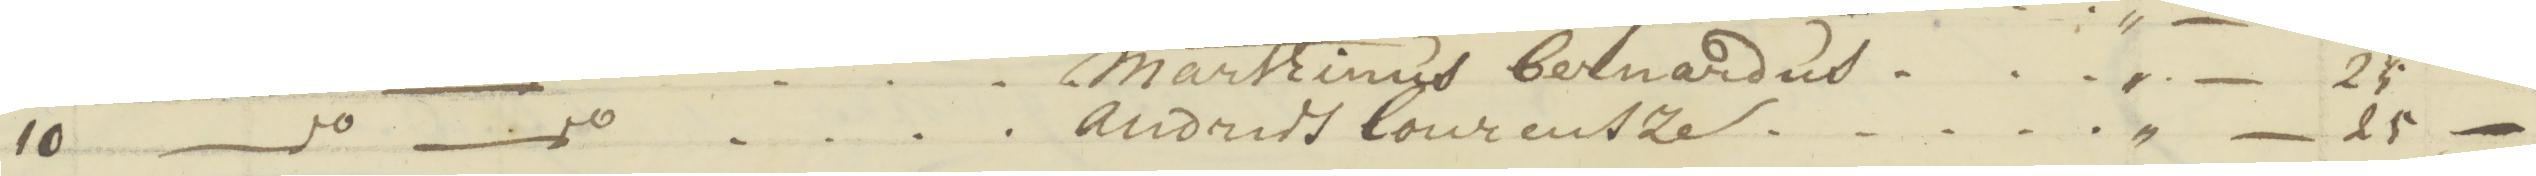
10 _o _o - . . . Andries lourensze . - - - . „ — 25 —
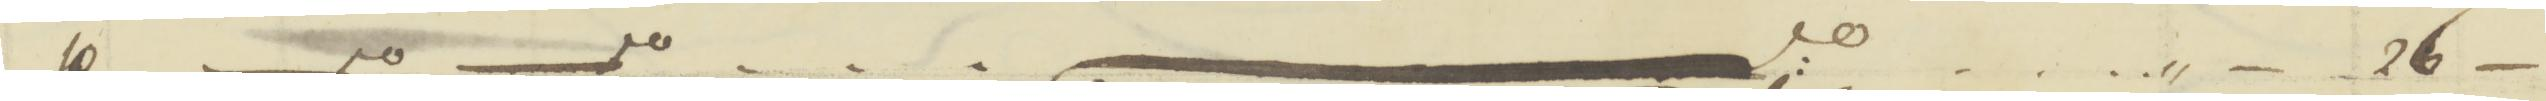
10 _o _o - - - _:o - . . .„ — 26 —
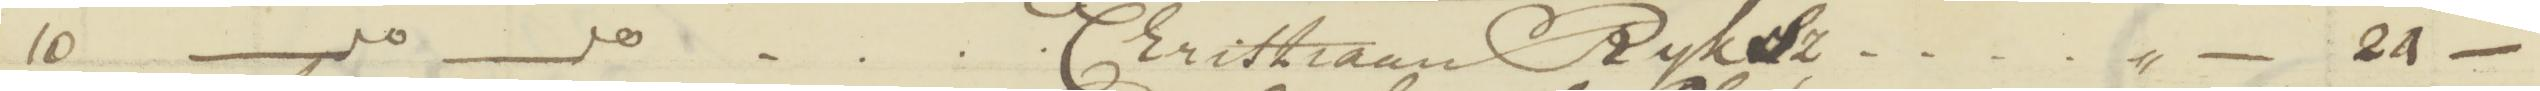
10 _o _o - . . . Christiaan Ryksz - - . . „ — 24 —
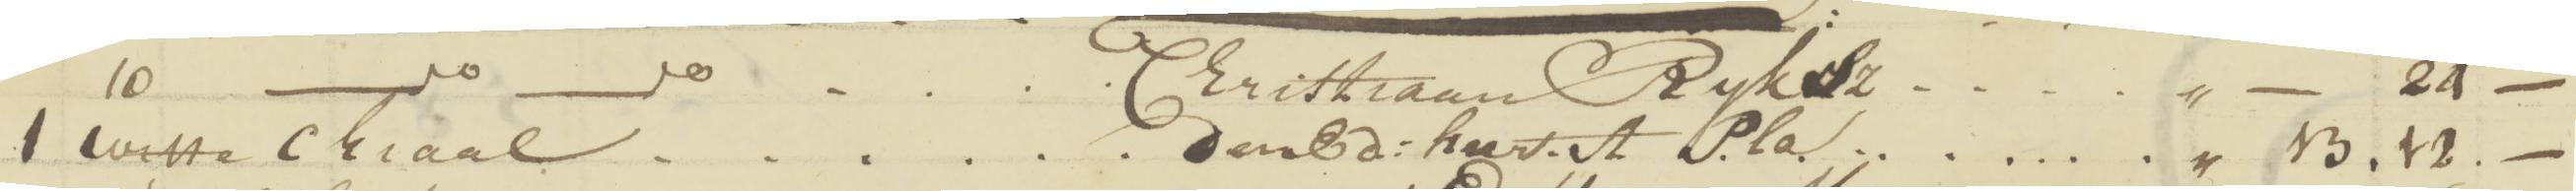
1 witte chiaal . . . . . . den Ed: heer. A. P.las. .. . . . . . „ 13.12.—
